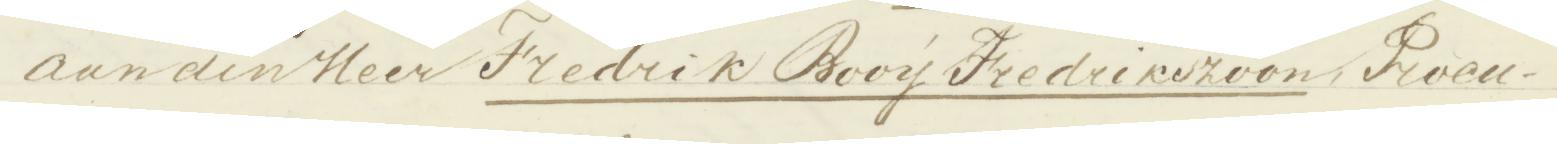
Aan den Heer Fredrik Booij Fredrikszoon, Procu-
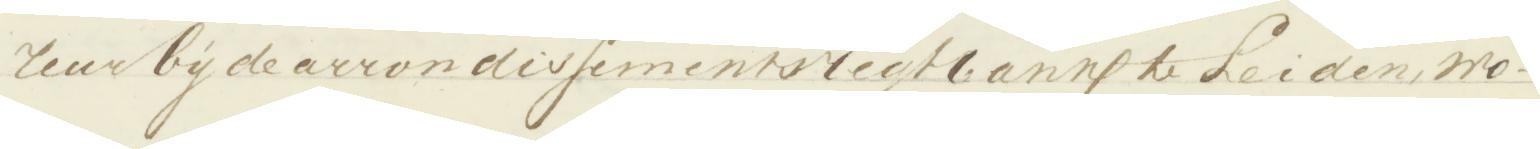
reur bij de arrondissementsregtbank te Leiden, wo-
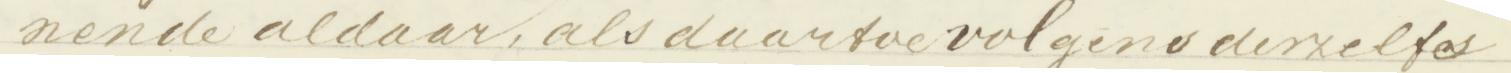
nende aldaar, als daartoe volgens derzelfs
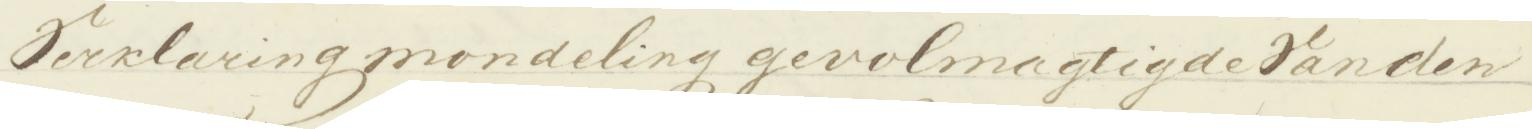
Verklaring mondeling gevolmagtigde Van den
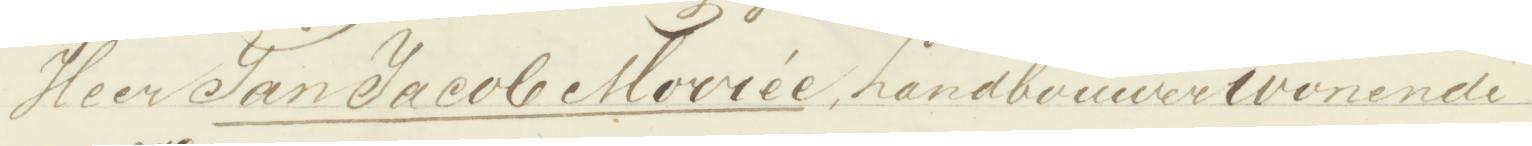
Heer Ian Iacob Morrée, Landbouwer wonende
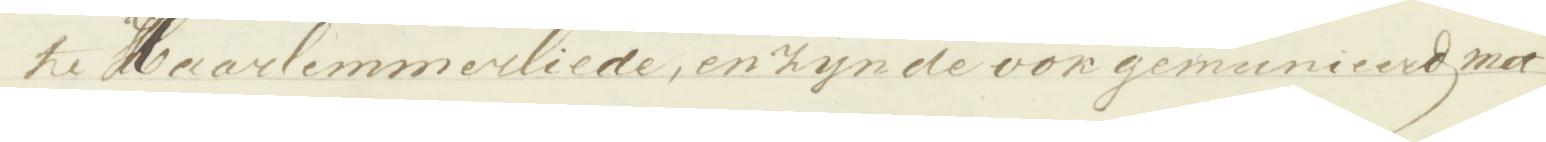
te Haarlemmerliede, en zijn de ook gemunieerd met
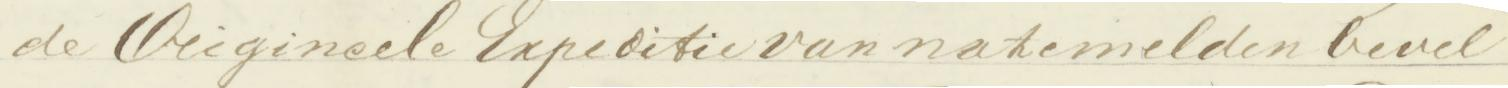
de Origineele Expeditie van natemelden bevel
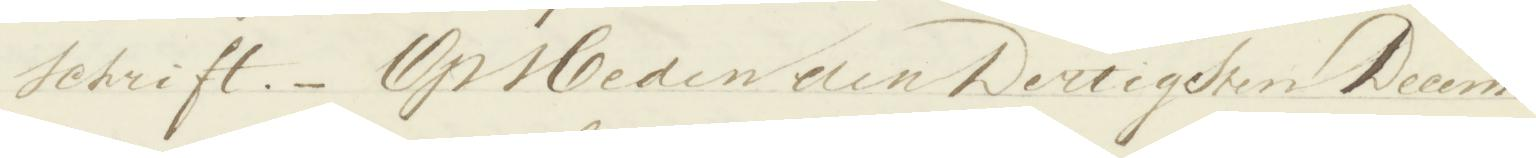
schrift. — Op Heden den Dertigsten Decem.
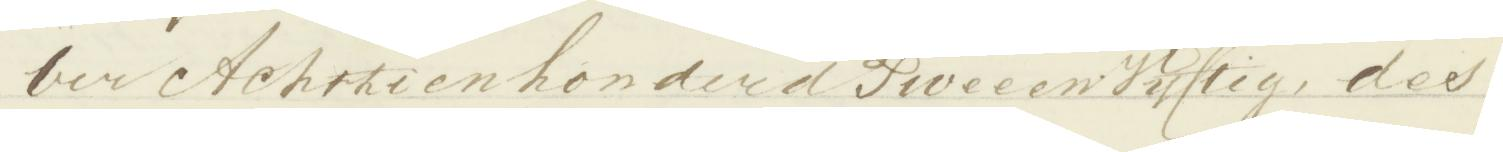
ber Achttienhonderd Twee en Vyftig, des
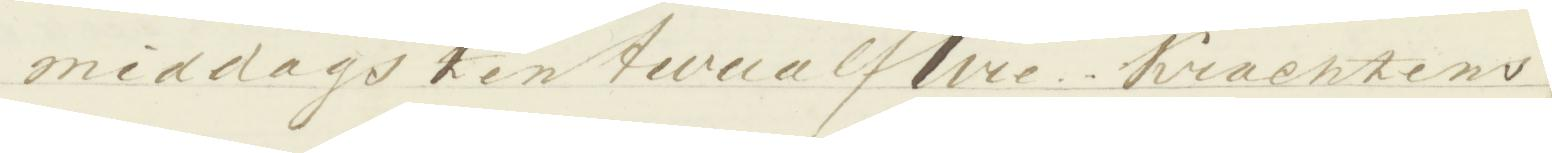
middags ten twaalf Ure.- Krachtens
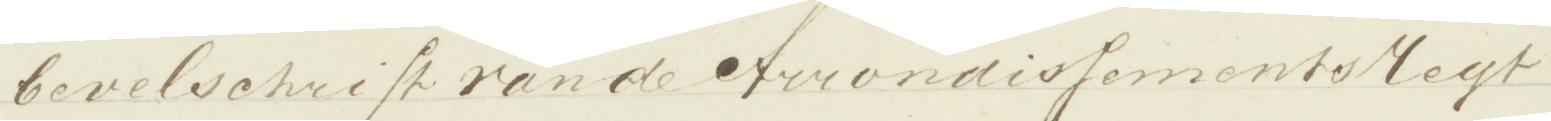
bevelschrift van de Arrondissements Regt
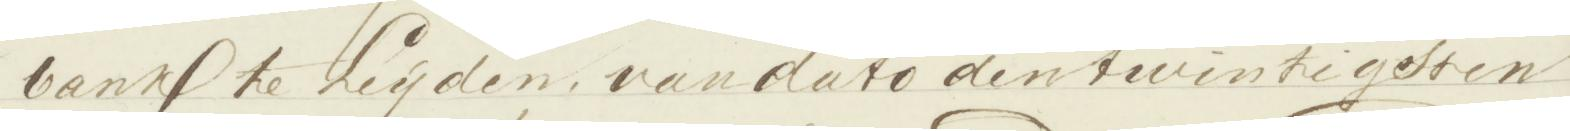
bank te Leijden, van dato den twintigsten
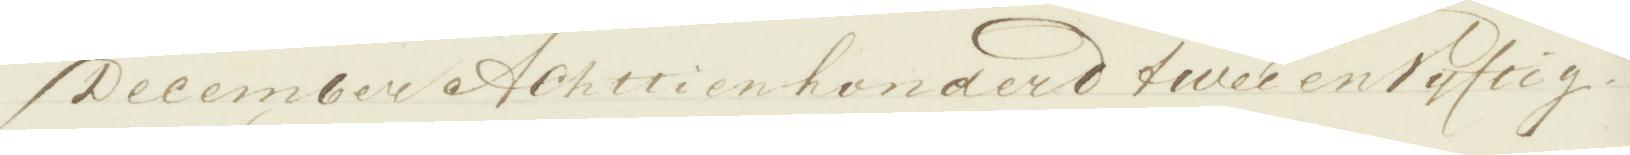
December Achttienhonderd twee en Vyftig.
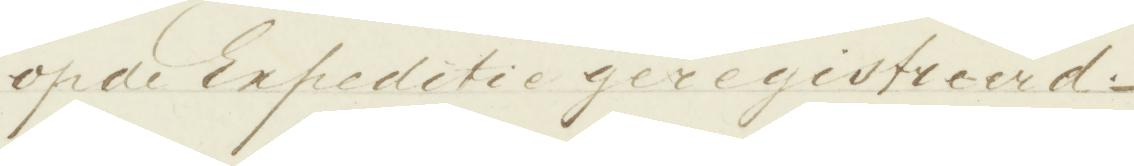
op de Expeditie geregistreerd.—
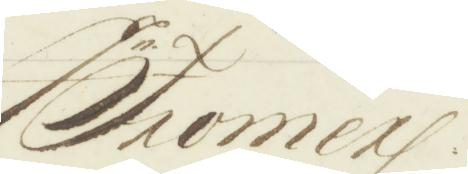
Jr. Fromers
